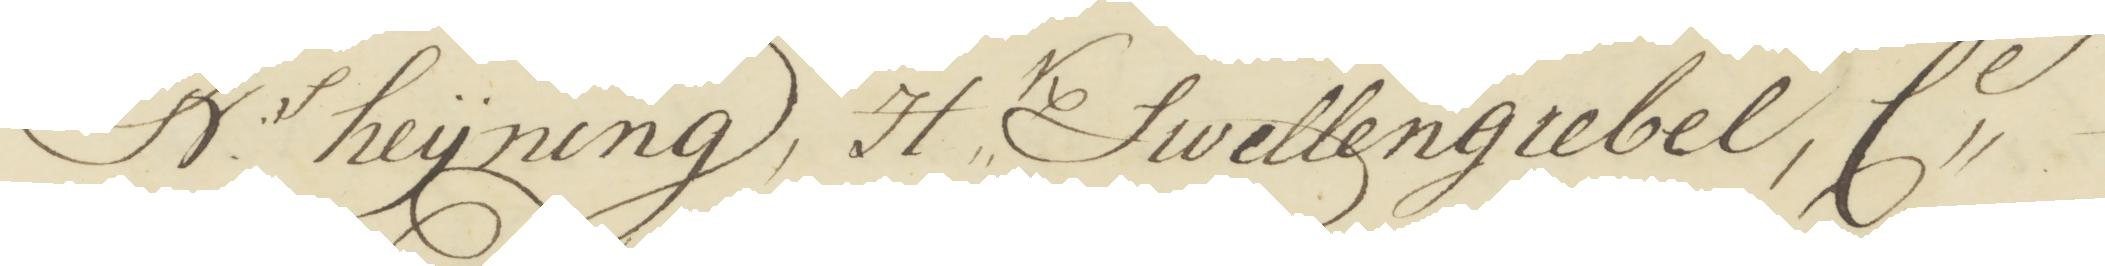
N:s heijning, H„k Swellengrebel, C„l
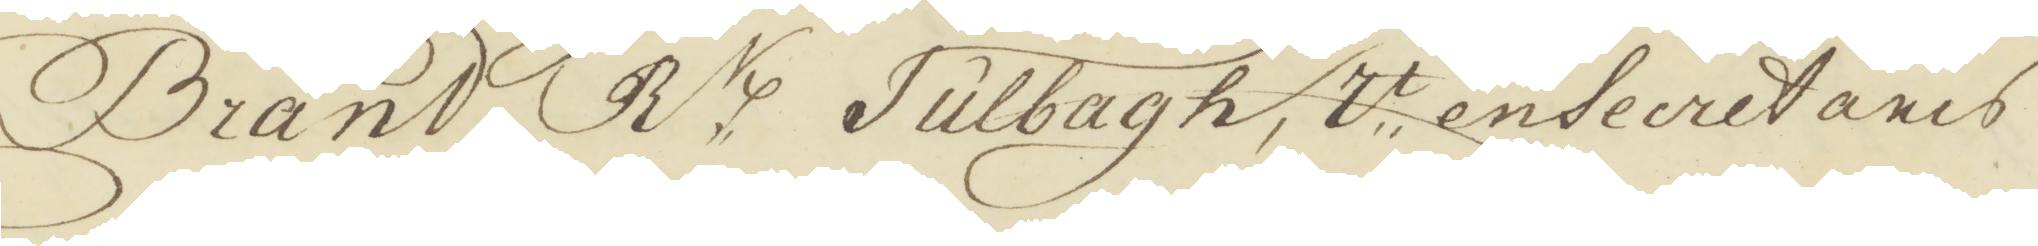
Brand, R„k Tulbagh, r„t en secretaris
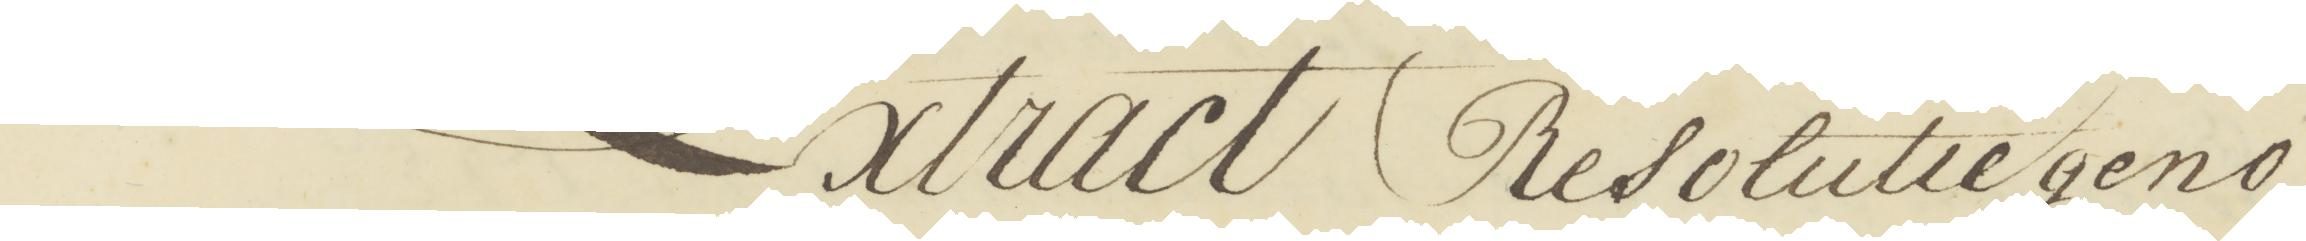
Extract Resolutie geno
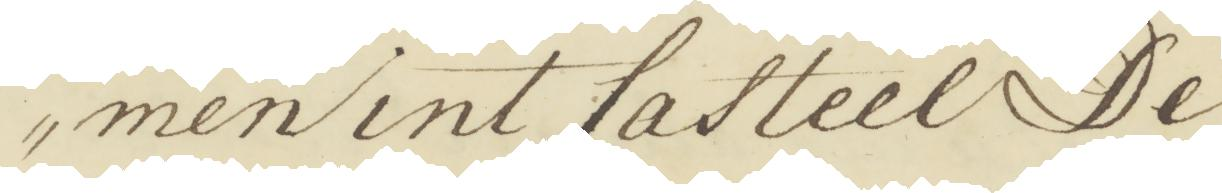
„men in't Casteel De
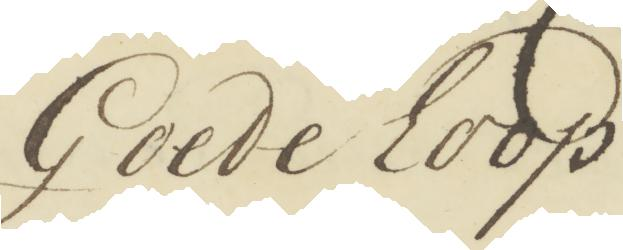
Goede hoop
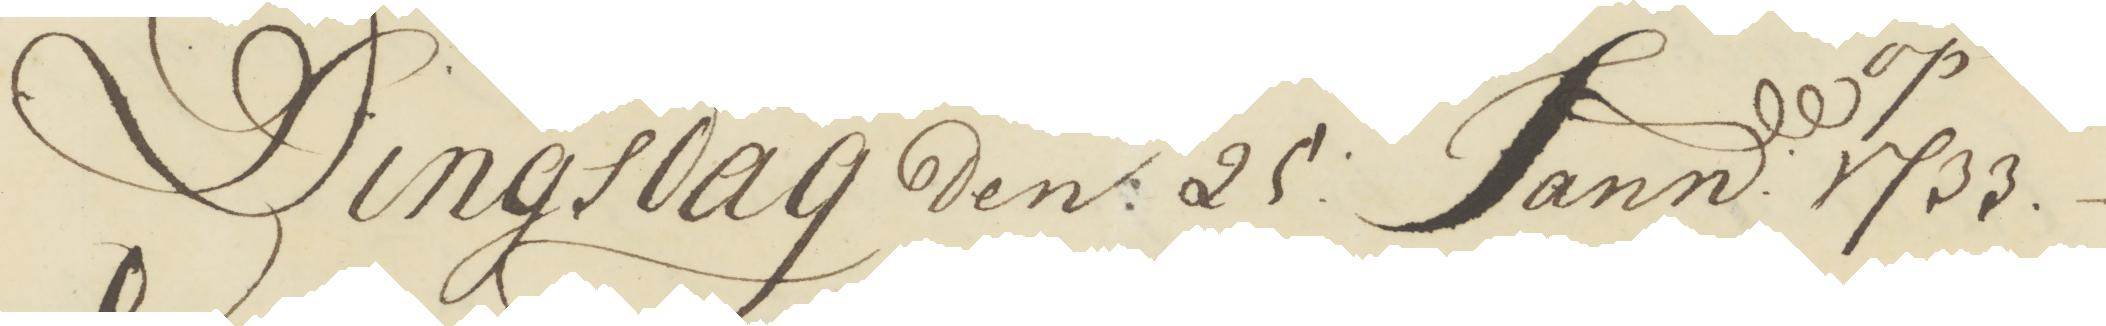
Dingsdag den 25:' Iann: 1733.
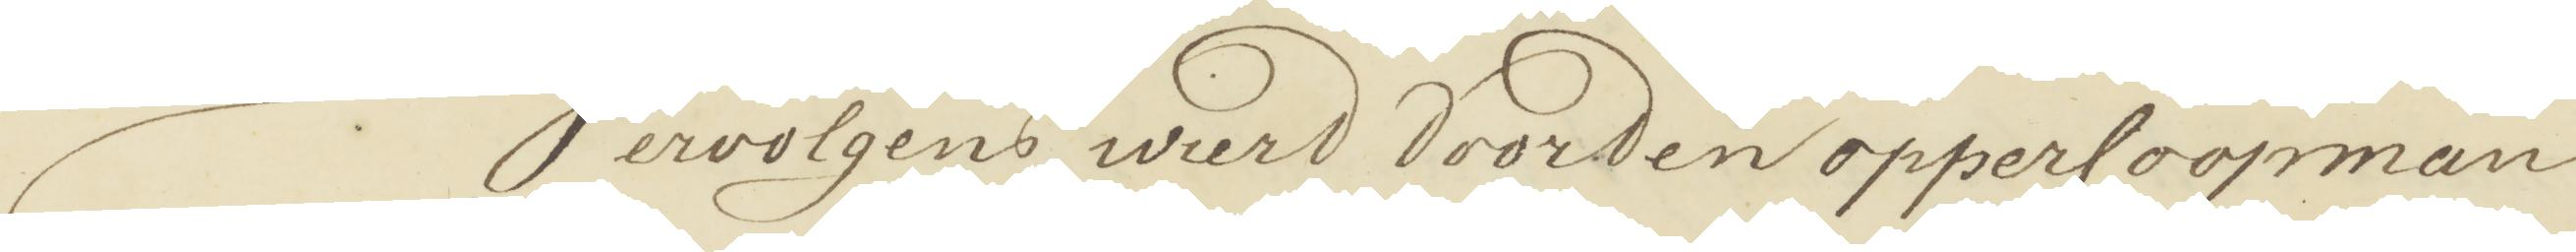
Vervolgens wierd door den oppercoopman
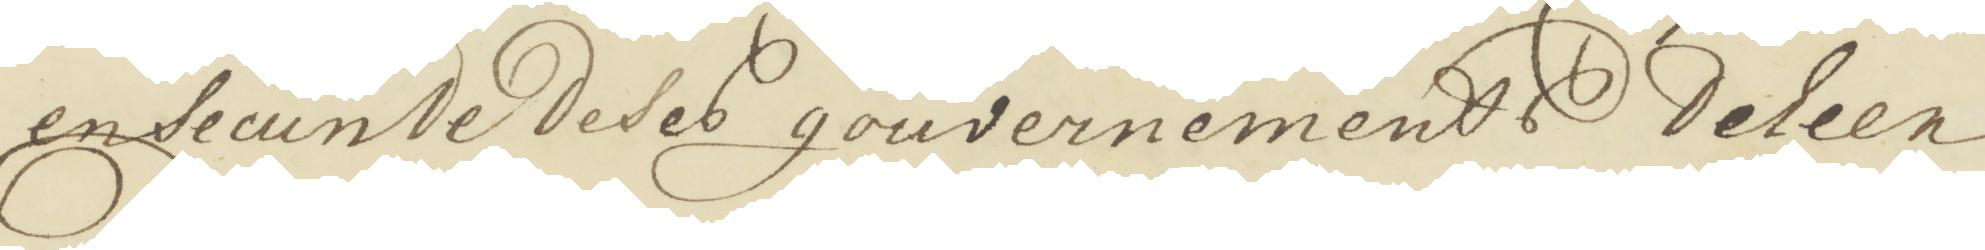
en secunde deses gouvernements de heer
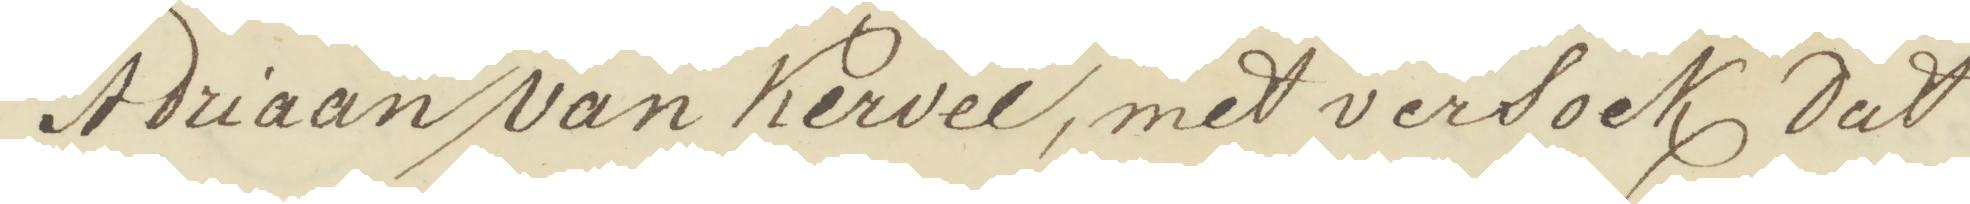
Adriaan van Kervel, met versoek dat
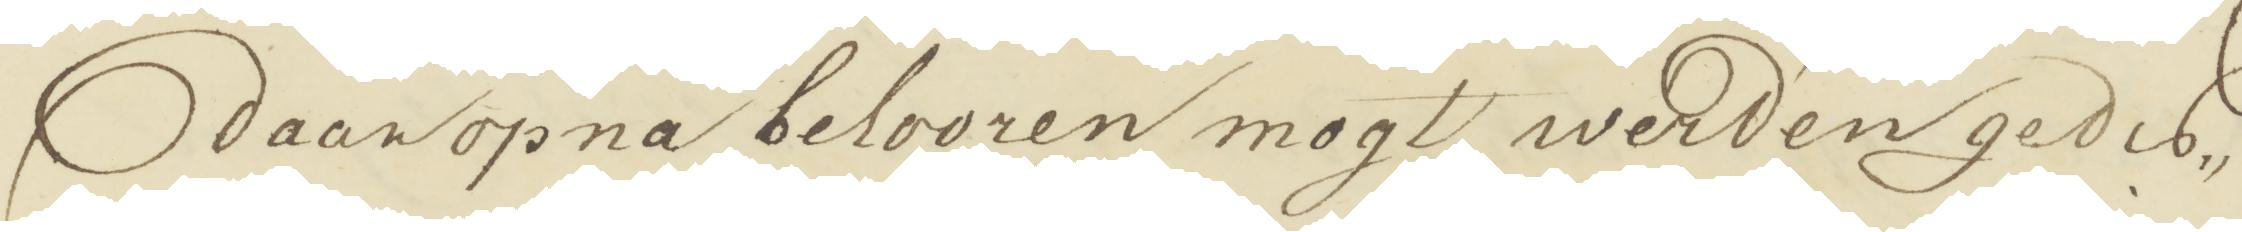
daar op na behooren mogt werden gedis„
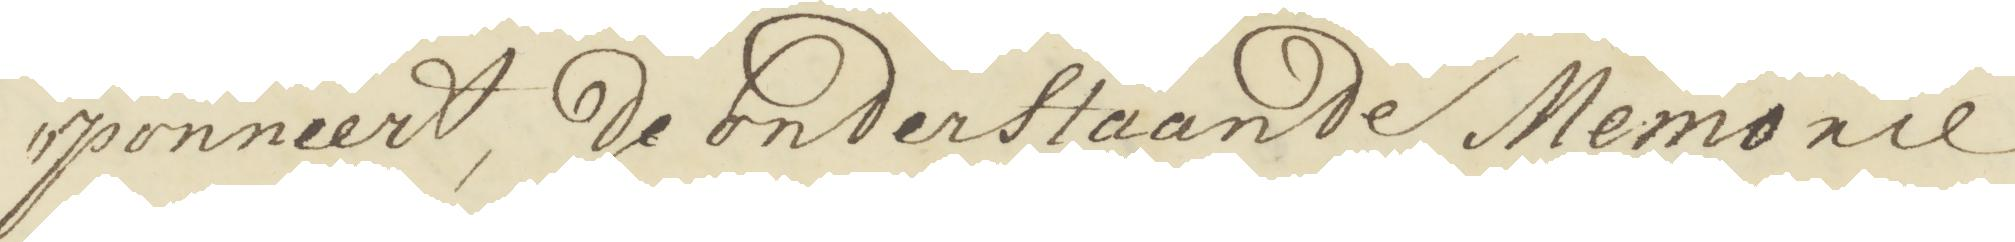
„ponneert, de onderstaande Memorie
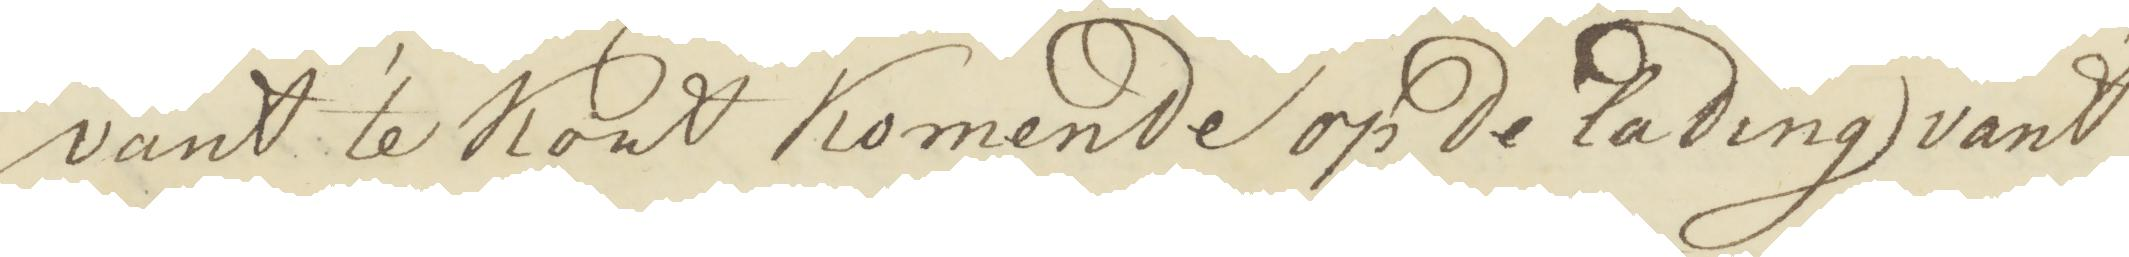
vant 'te kort komende op de lading vant
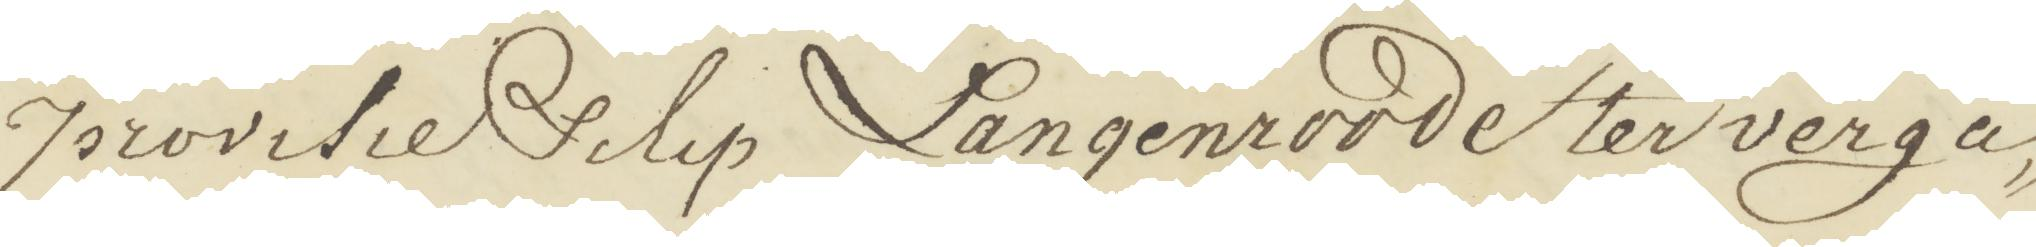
provisie schip Langenroode ter verga„
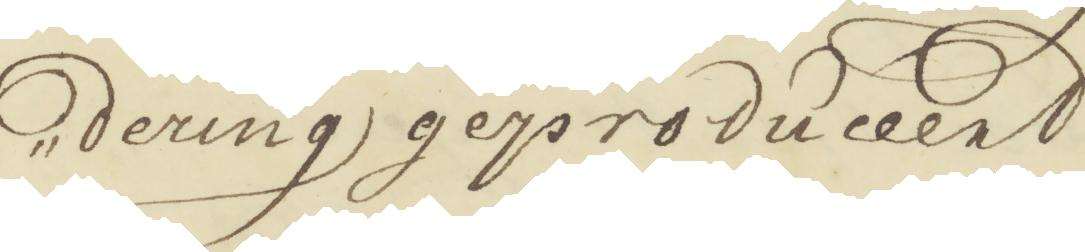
„dering geproduceerd
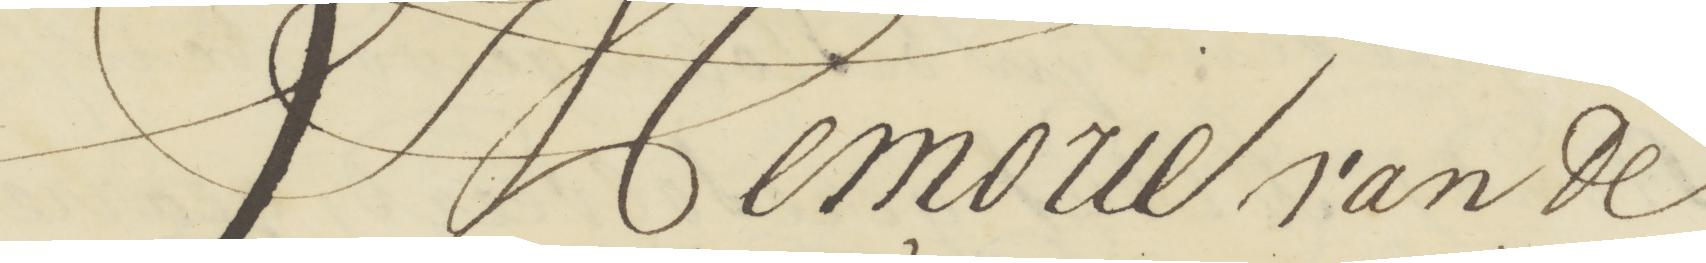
Memorie van de
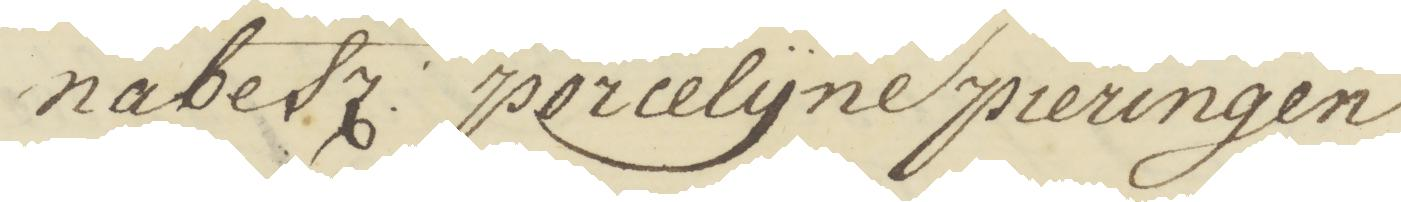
nabesz:' porcelijne pieringen
